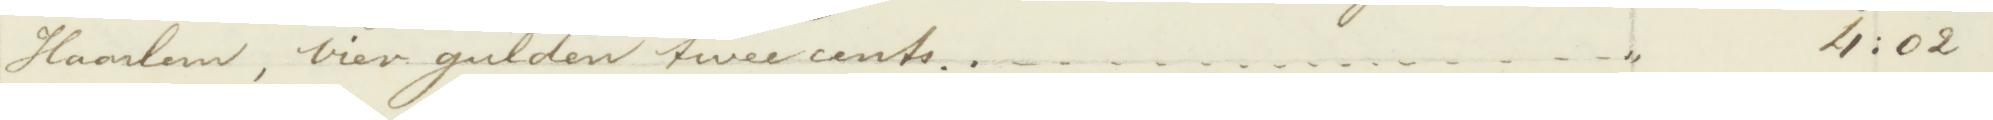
Haarlem, vier gulden twee cents. . - - - - - - - - - - - - - - - „ 4: 02
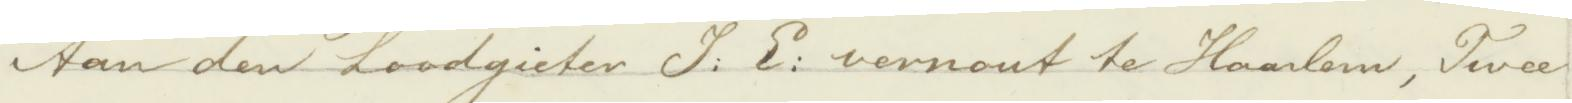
Aan den Loodgieter I: E: vernout te Haarlem, Twee
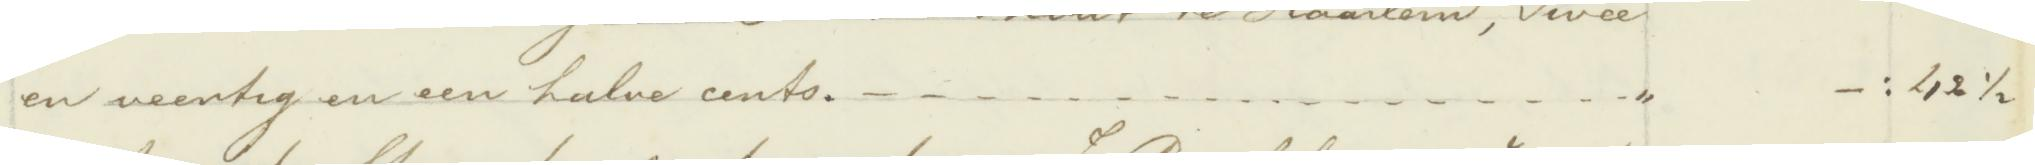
en veertig en een halve cents. - - - - - - - - - - - - - - - - - - „ — : 42½
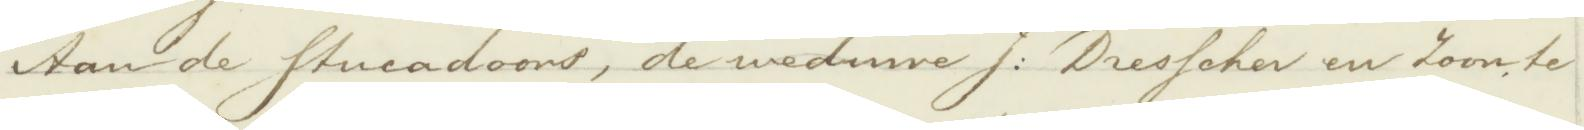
Aan de stucadoors, de weduwe J: Dresscher en zoon, te
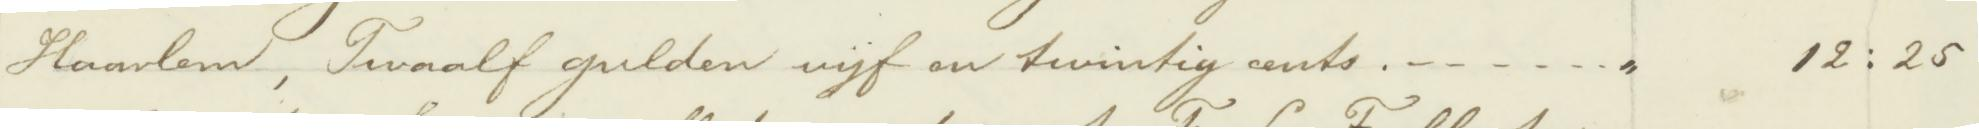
Haarlem, Twaalf gulden vijf en twintig cents. - - - - - - „ 12: 25
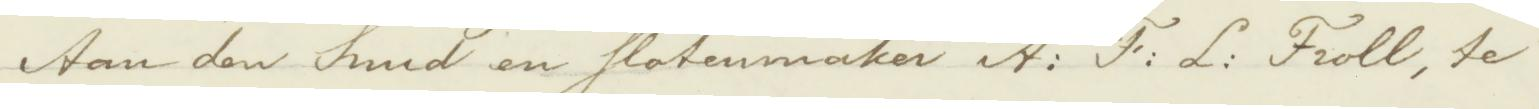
Aan den Smid en slotenmaker A: F: L: Troll, te
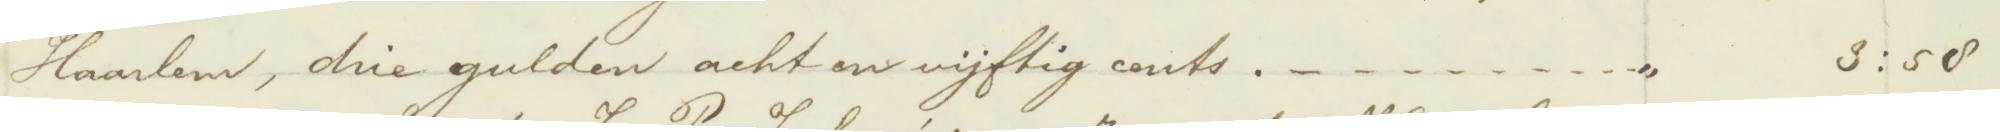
Haarlem, drie gulden acht en vijftig cents. - - - - - - - - - „ 3: 58
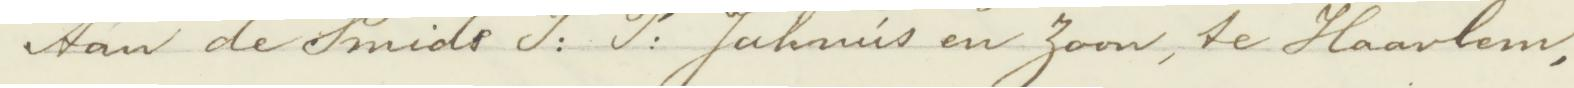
Aan de Smids J: P: Jahnus en Zoon, te Haarlem,
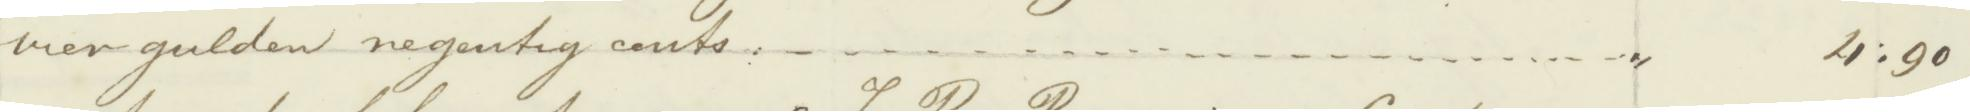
vier gulden negentig cents. - - - - - - - - - - - - - - - - - - - - - - - - „ 4: 90
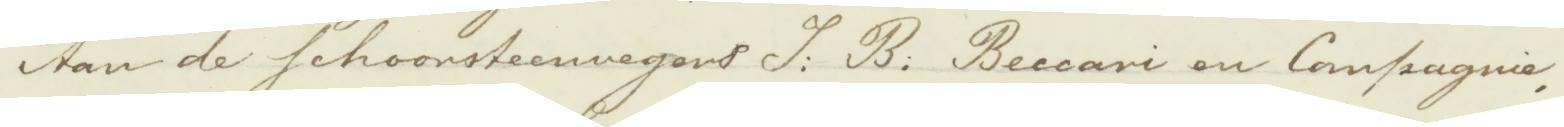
Aan de schoorsteenvegens J: B: Beccari en Compagnie,
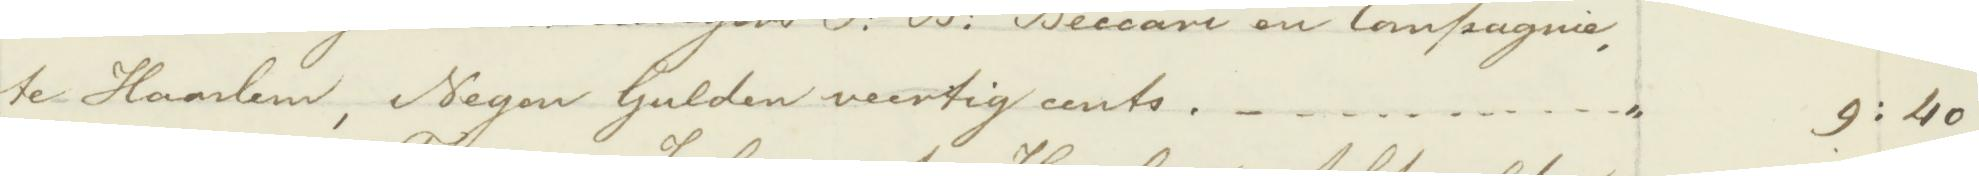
te Haarlem, Negen Gulden veertig cents. - - - - - - - - - - - „ 9: 40
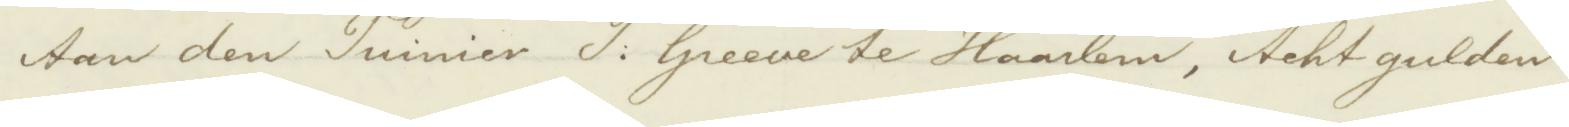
Aan den Tuinier I: Greeve te Haarlem, Acht gulden
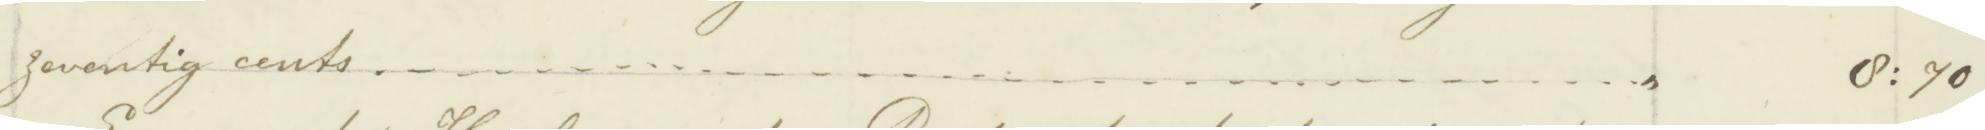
zeventig cents. - - - - - - - - - - - - - - - - - - - - - - - - - - - - - - - - - „ 8: 70
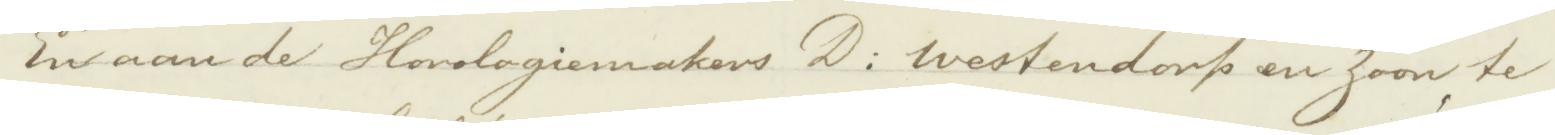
En aan de Horolagiemakers D: Westendorp en zoon, te
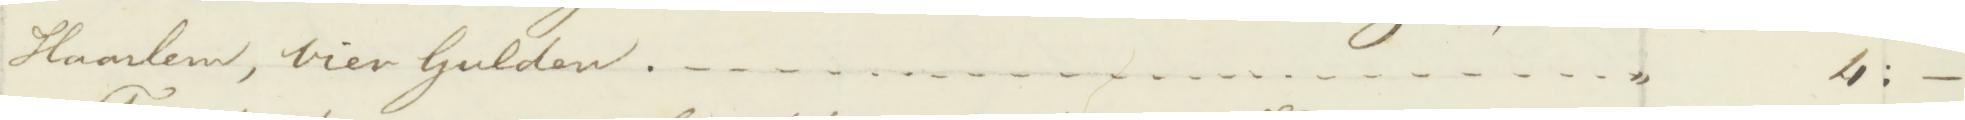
Haarlem, vier Gulden. - - - - - - - - - - - - - - - - - - - - - - - „ 4: —
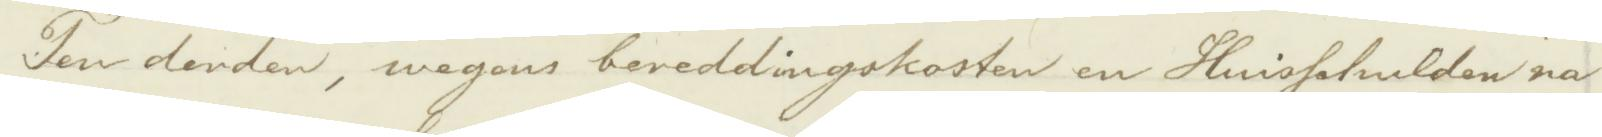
Ten derden, wegens bereddingskosten en Huisschulden na
